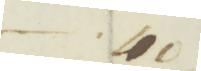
- - .40
